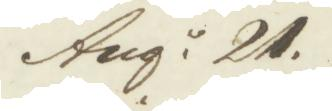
Aug.s 21.
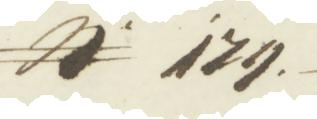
N=o 179.
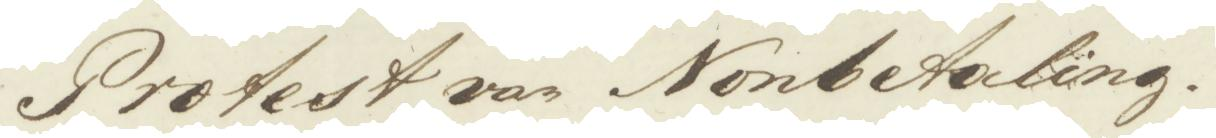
Protest van Nonbetaling.
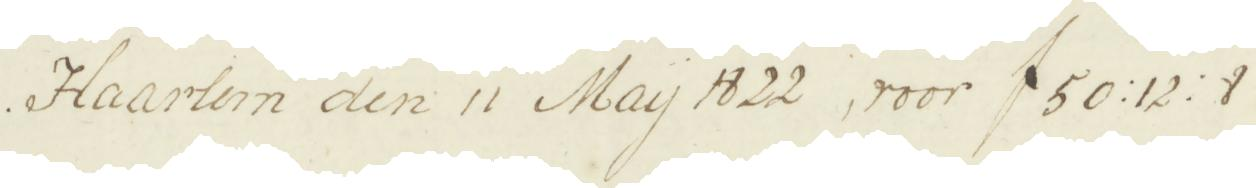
Haarlem den 11 Maij 1822, voor ƒ50:12: 8
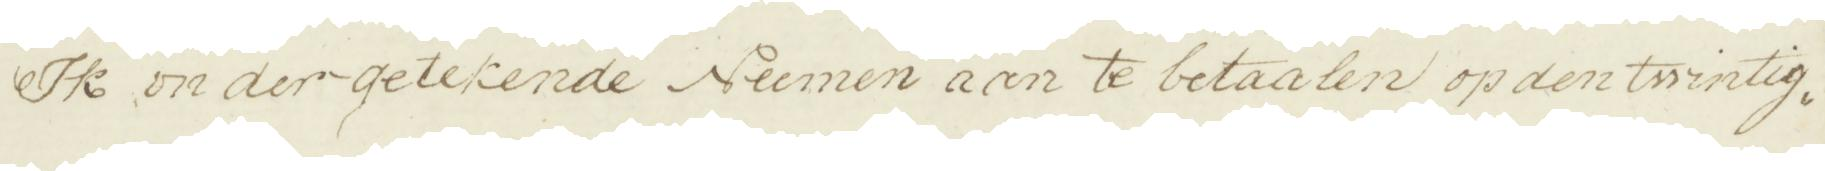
Ik ondergetekende Neemen aan te betaalen op den twintig„
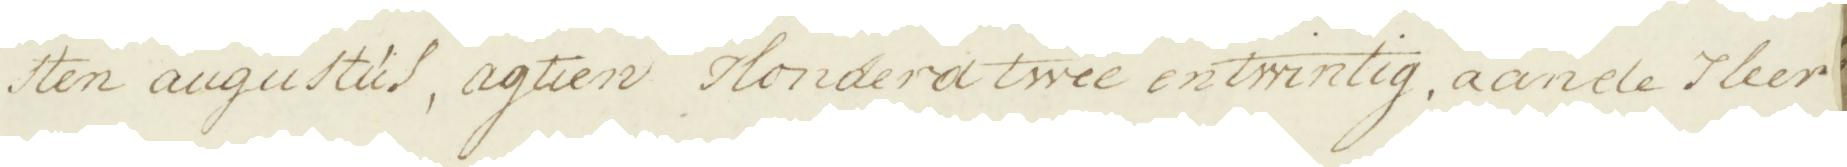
sten augustus, agtien Honderd twee en twintig, aan de Heer
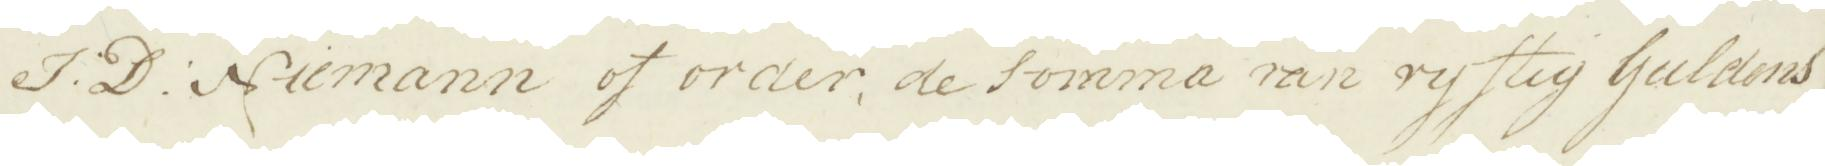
I: D: Niemann of order, de somma van vyftig Guldens
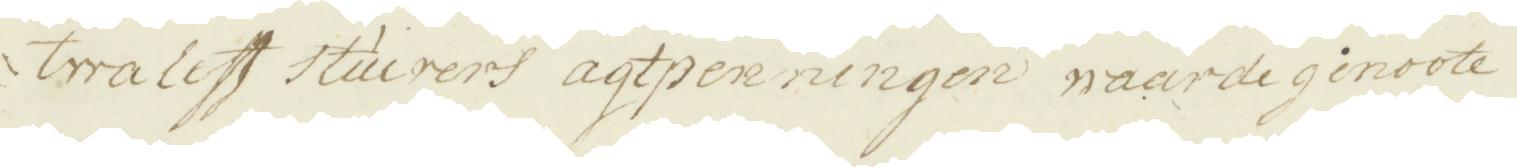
twaleff stuivers agtpenningen waarde genoote
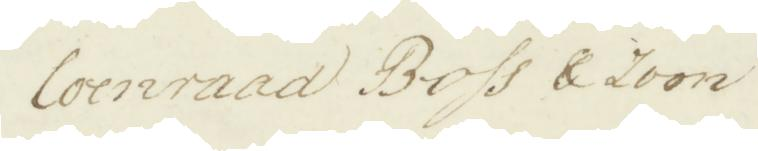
Coenraad Boss & zoon
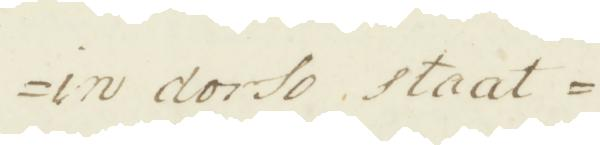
= in dorso staat=
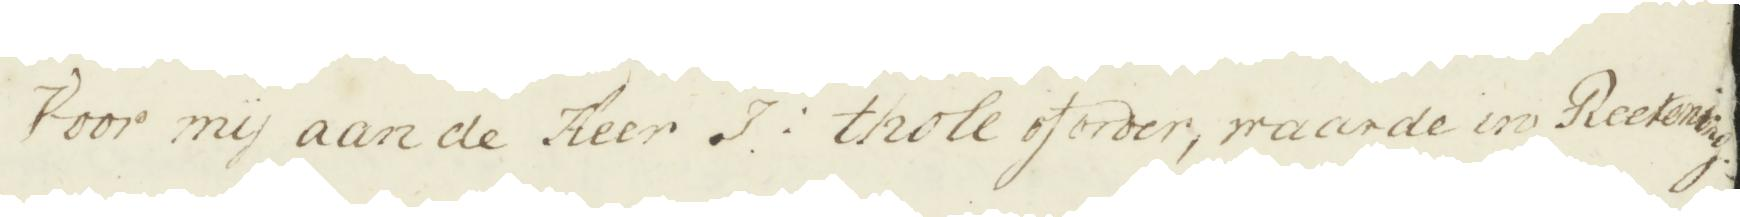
Voor mij aan de Heer I: thole of order, waarde in Reekening
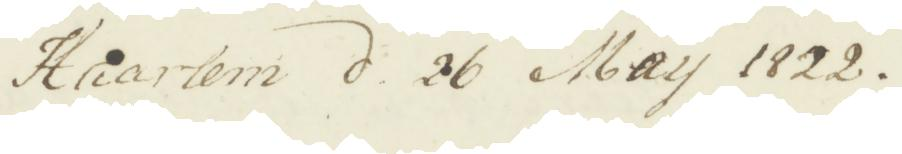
Haarlem d. 26 Maij 1822.
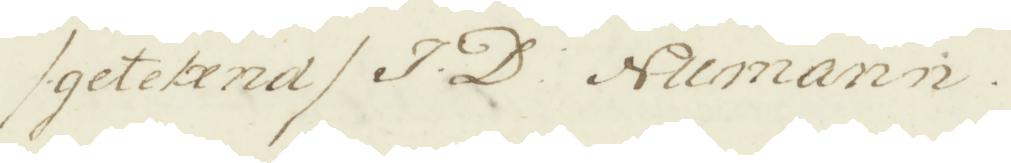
/getekend/ I. D: Niemann.
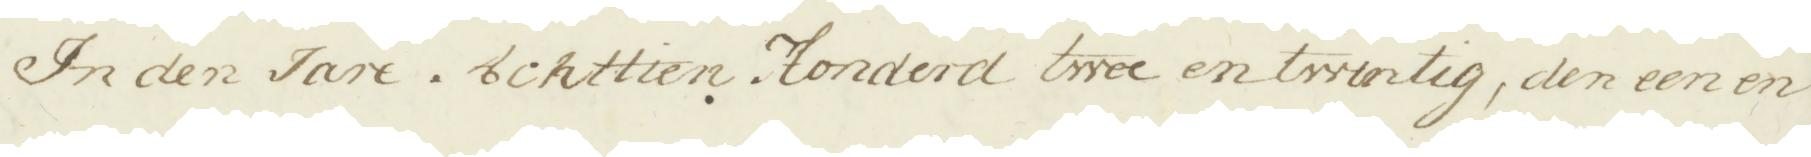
In den Jare Achttien Honderd twee en twintig, den een en
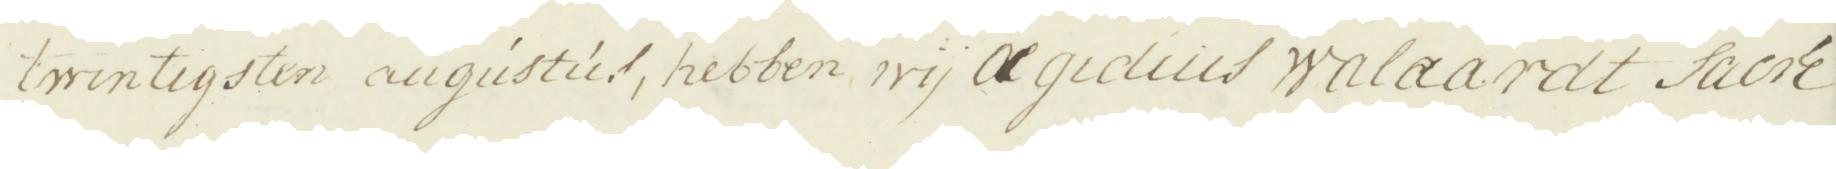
twintigsten augustus, hebben wij aegiduis walaardt sacré
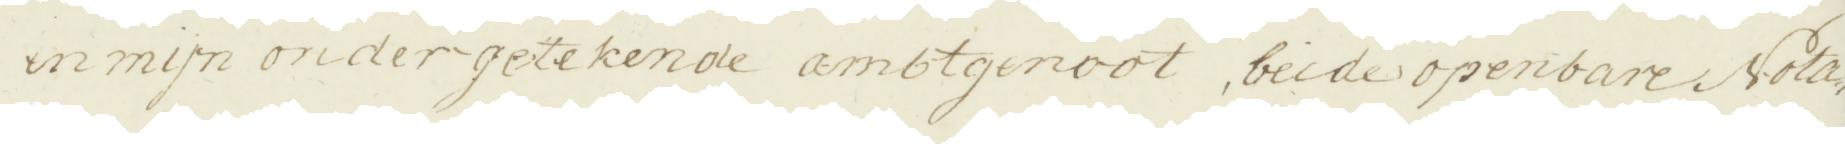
en mijn onder getekende ambtgenoot, beide openbare Nota
